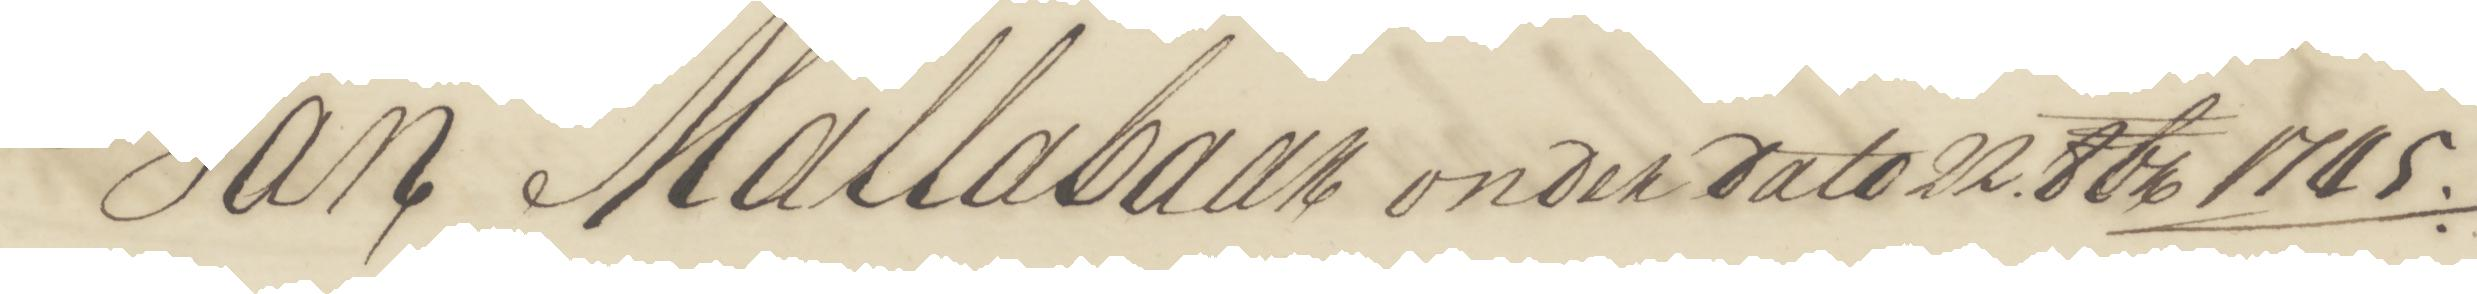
Van Mallabaar onder dato 22. 8br 1745./.
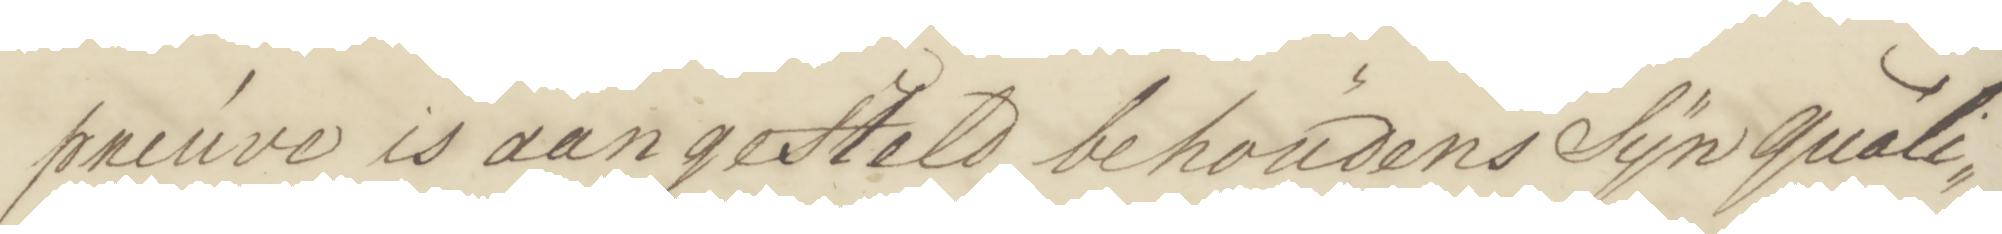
preuve is aangesteld behoudens sijn quali„
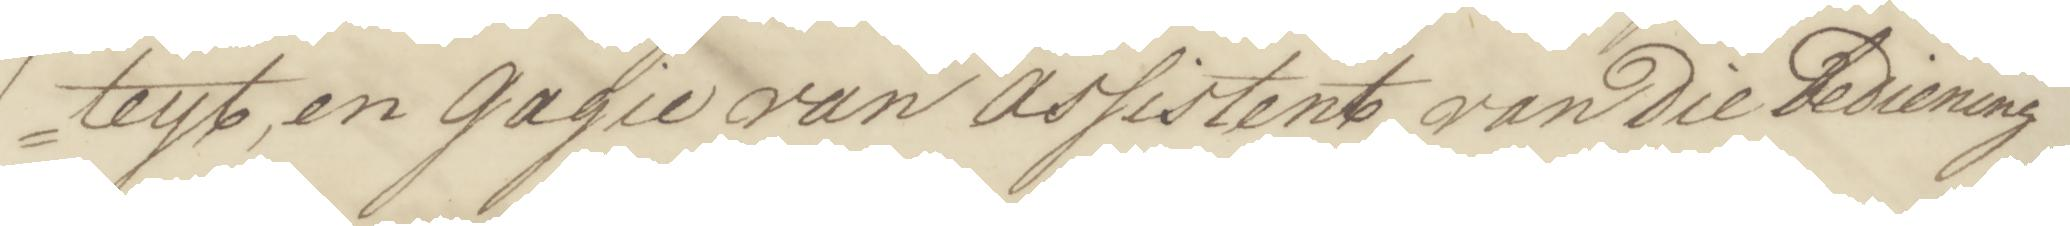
„teijt, en gagie van assistent, van die bediening
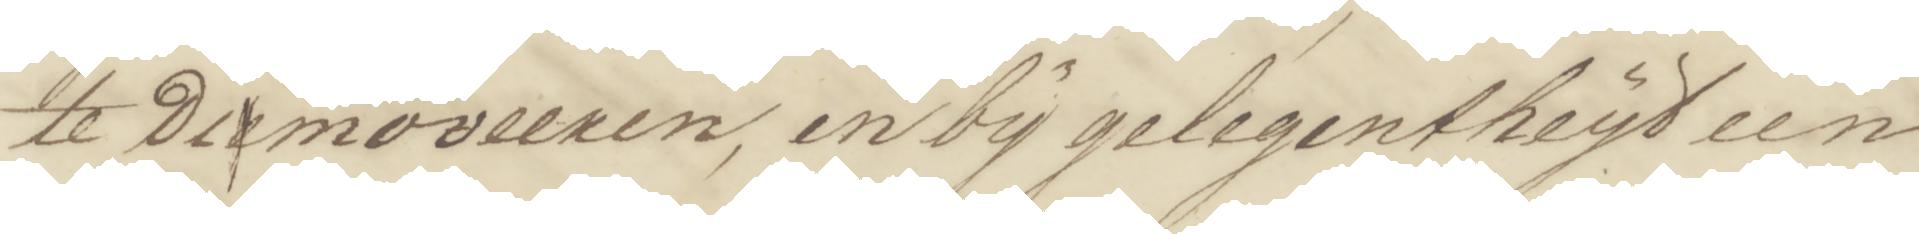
te diemoveeren, en bij gelegentheijt een
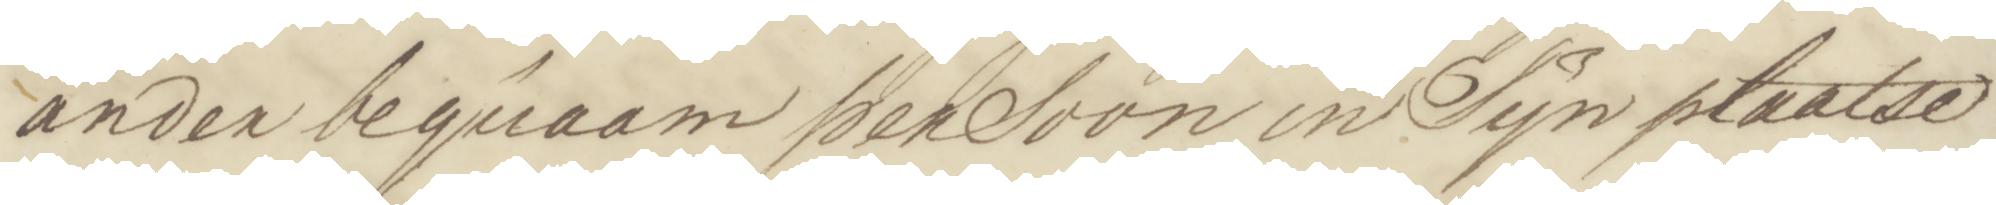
ander bequaam persoon in sijn plaatse
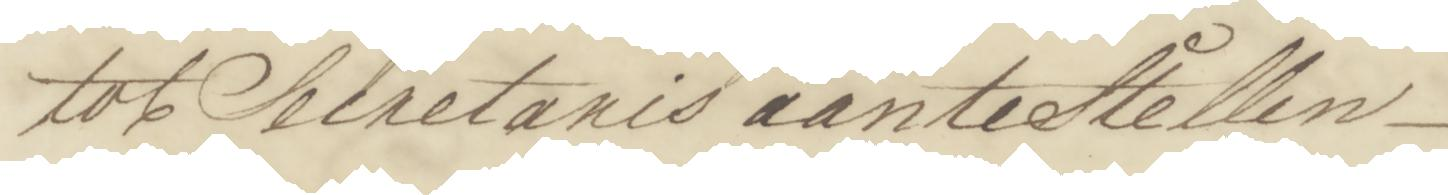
tot Secretaris aan te stellen—
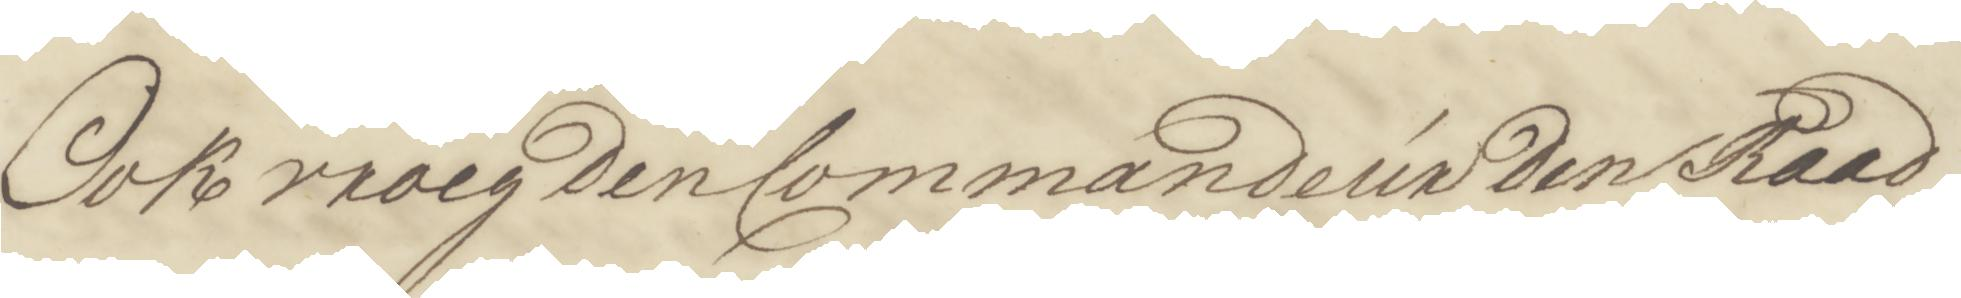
Ook vroeg den Commandeur den Raad
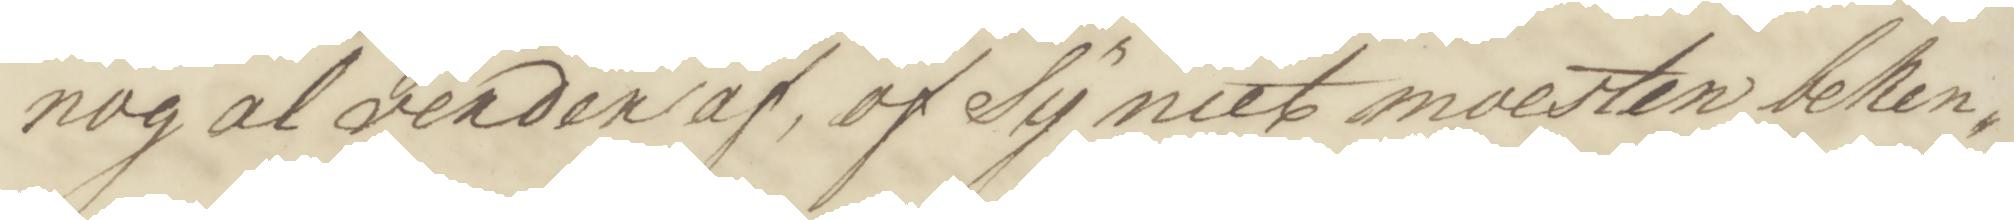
nog al verder af, of sij niet moesten beken„
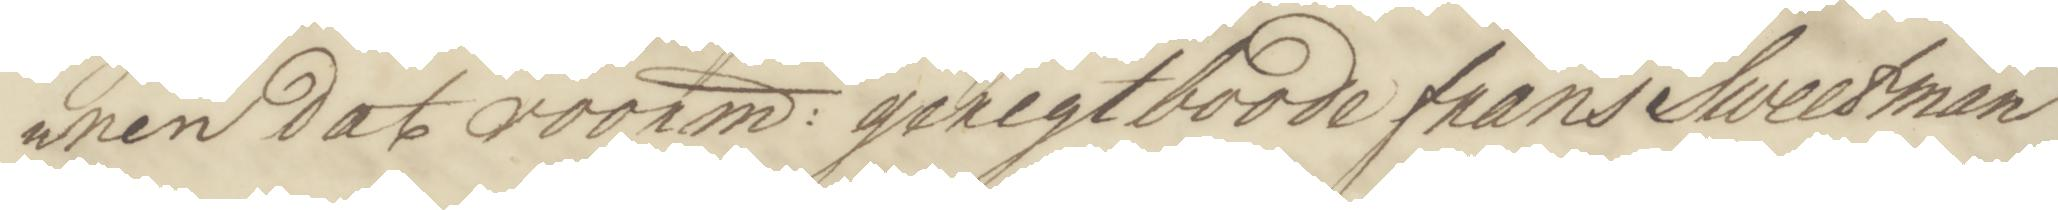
„nen dat voorm: geregtboode frans sweetman
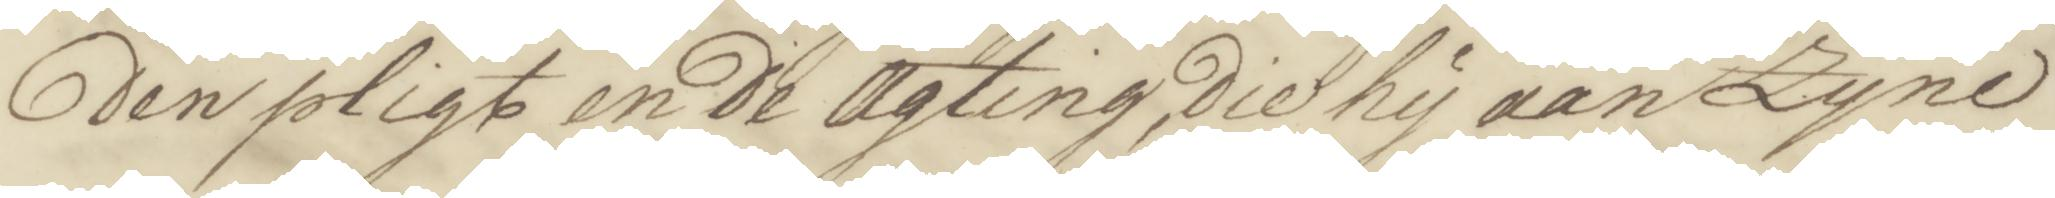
den pligt en de agting, die hij aan zijne
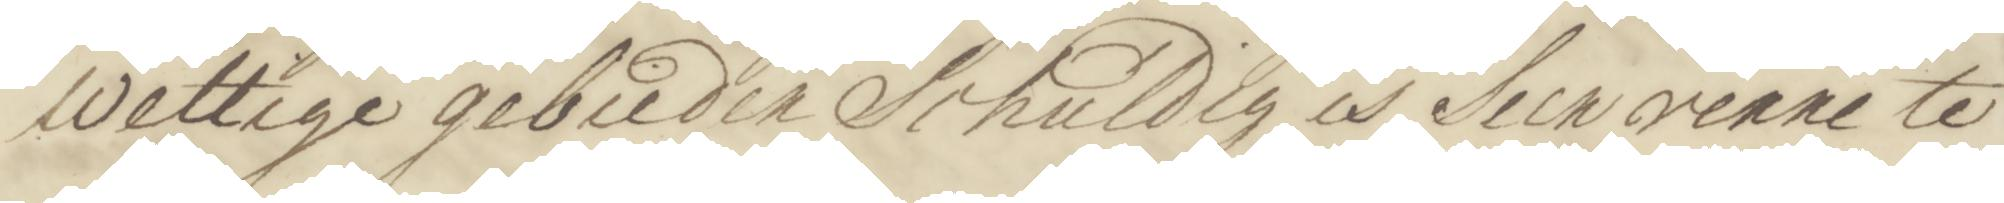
wettige gebieder schuldig is, seer verre te
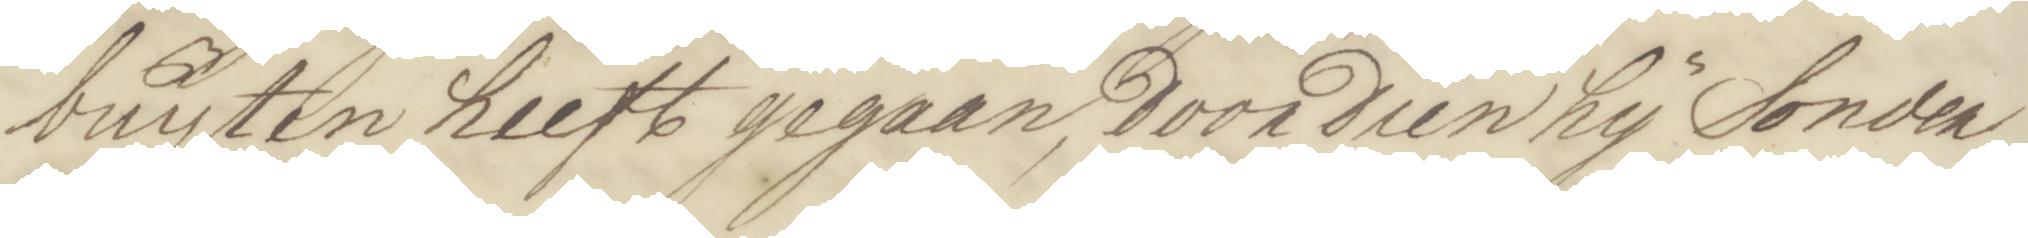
buijten heeft gegaan, door dien hij sonder
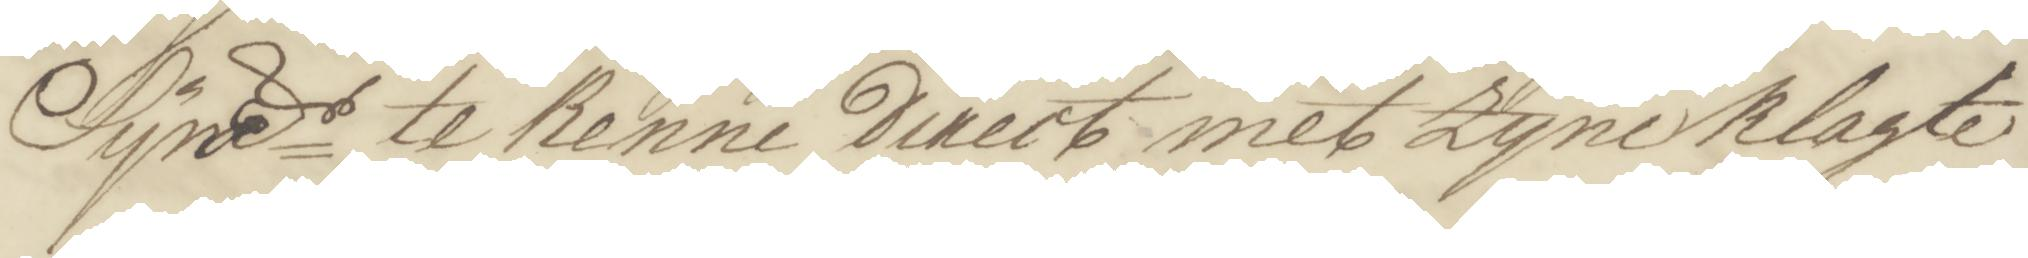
sijn E=t te kenne direct met zijne klagte
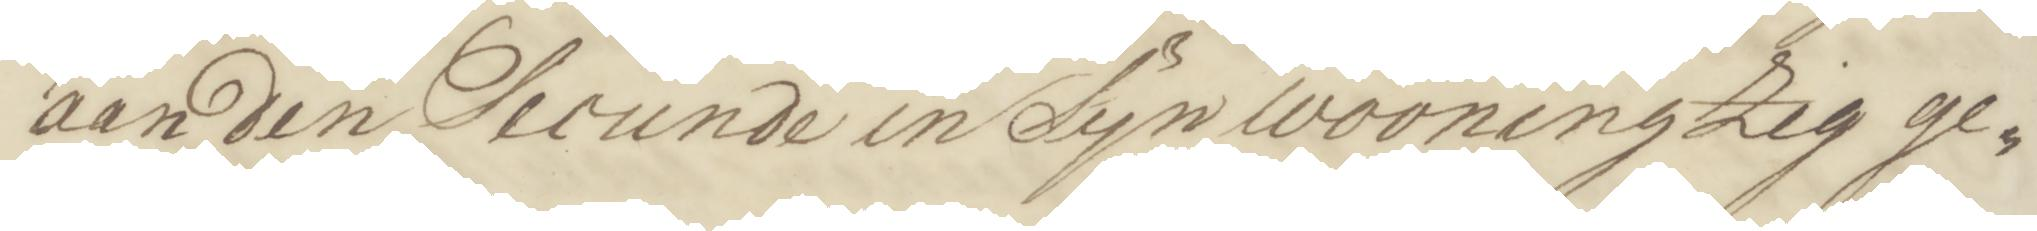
aan den secunde in sijn wooning zig ge„
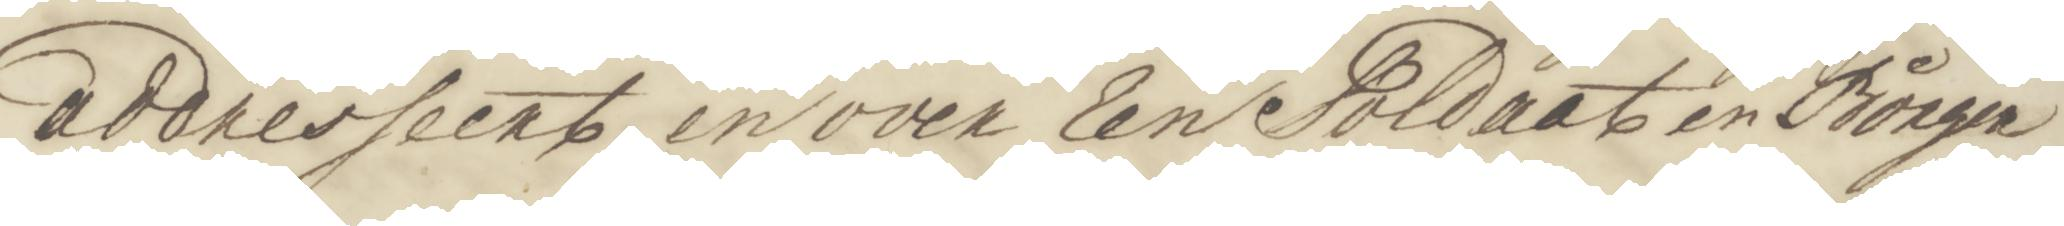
addresseert en over Een soldaat en Borger
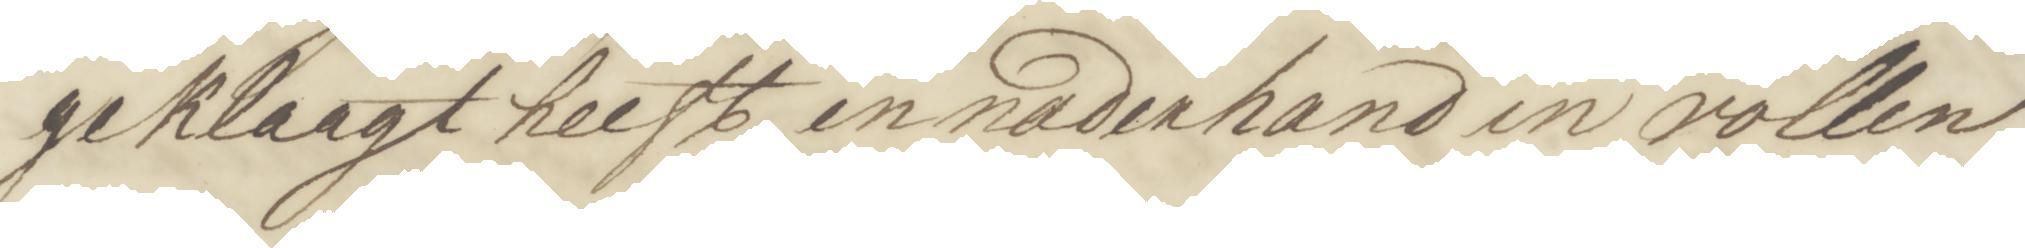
geklaagt heeft, en naderhand in vollen
